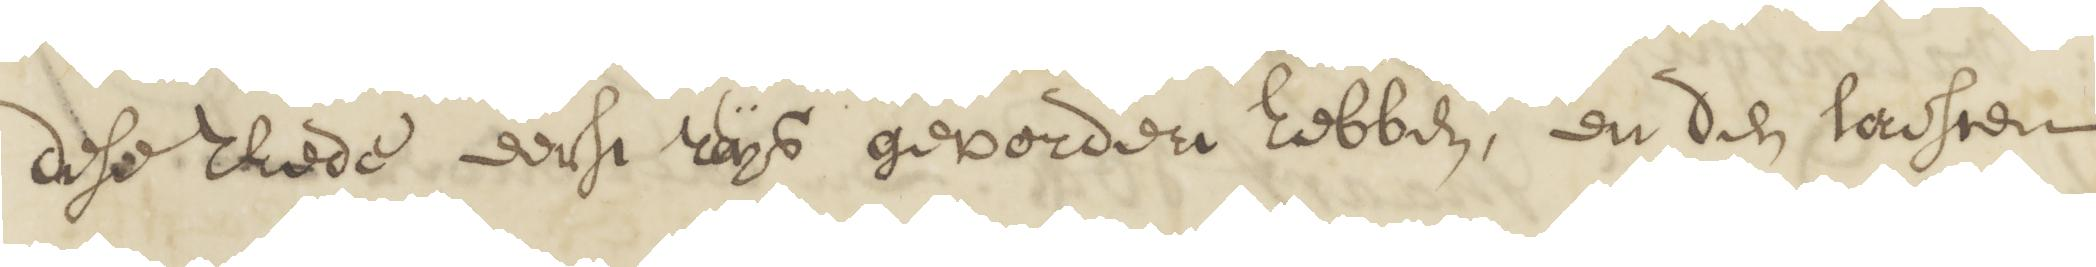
dese rhede eerst reijs gevordert hebben, en den laesten
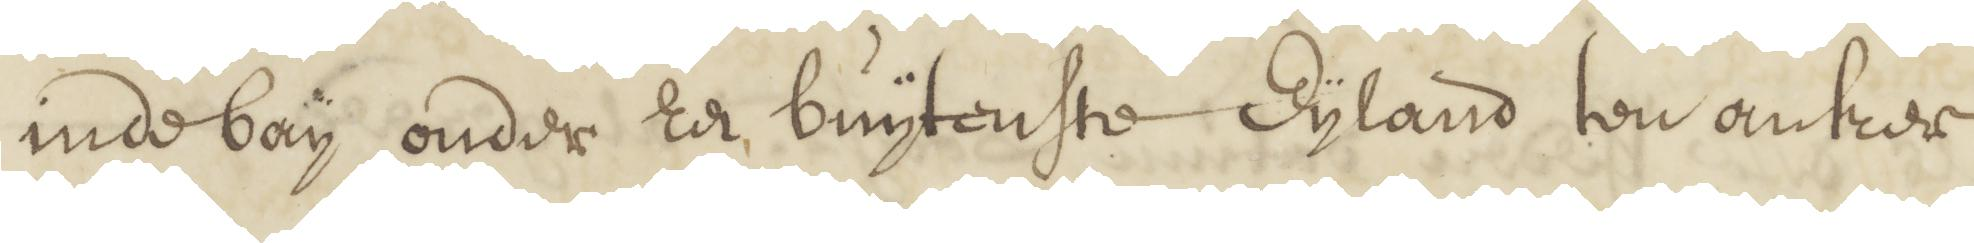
inde baij onder het buijtenste Eijland ten anker
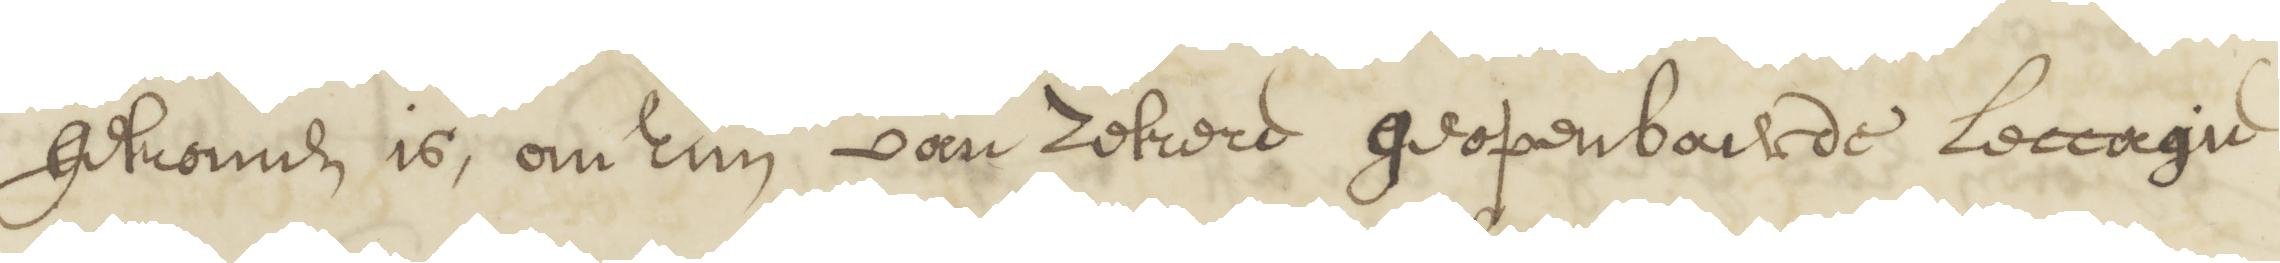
gekomen is, om hun van zekere geopenbaerde leccagie
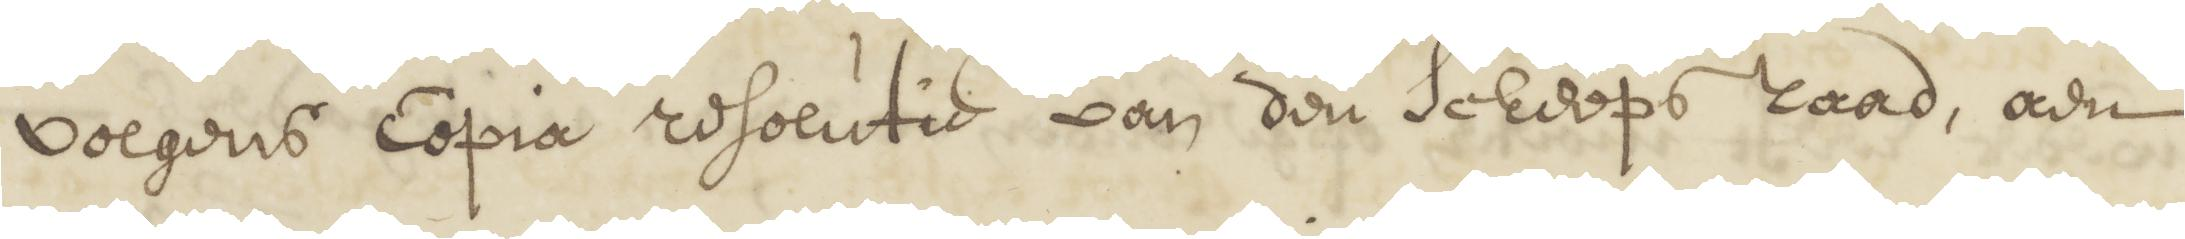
volgens Copia resolutie van den scheepsraad, aen
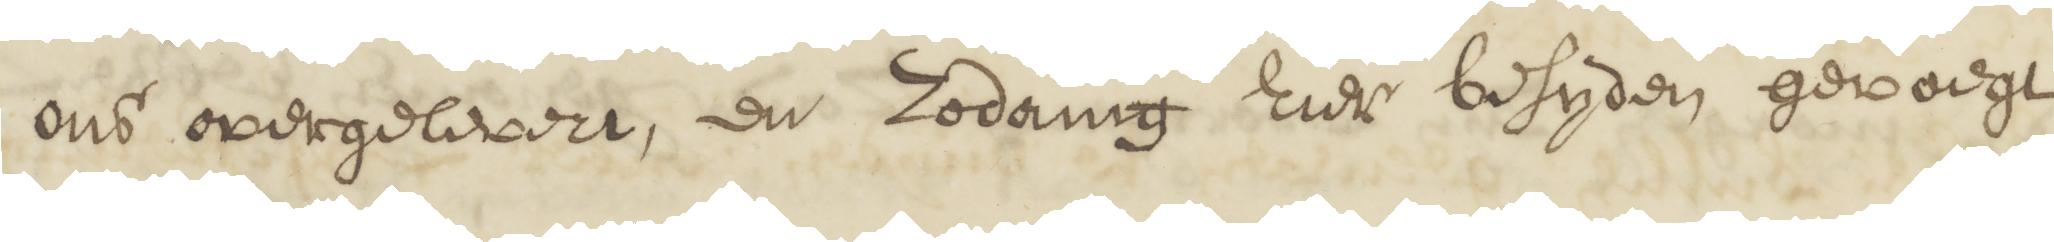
ons overgelevert, en zodanig hier besyden gevoegt
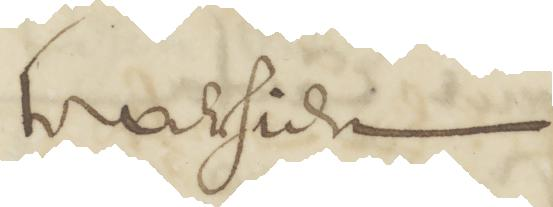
te versien.
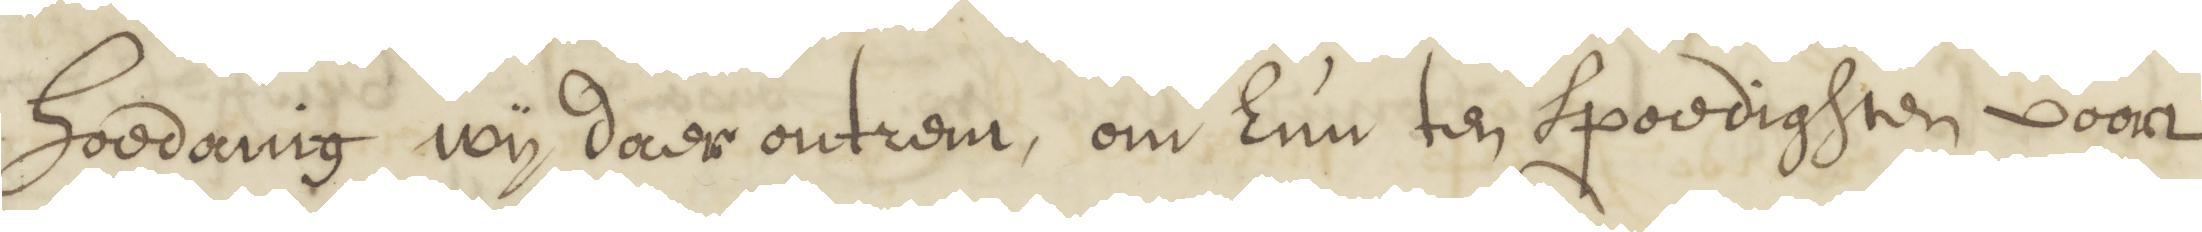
Hoedanig wij daer ontrent, om hun ten spoedigsten voort
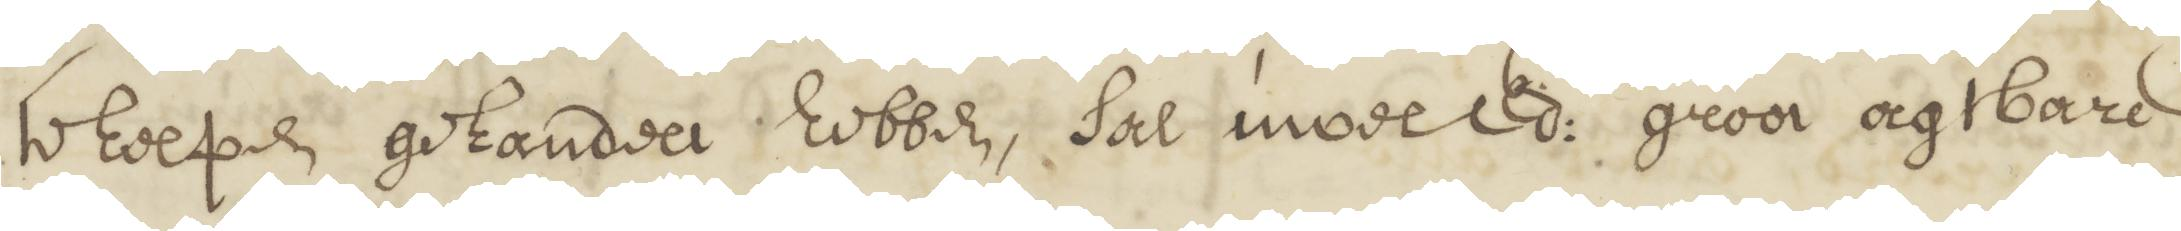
te helpen gehandelt hebben, sal uwel Ed: groot agtbare
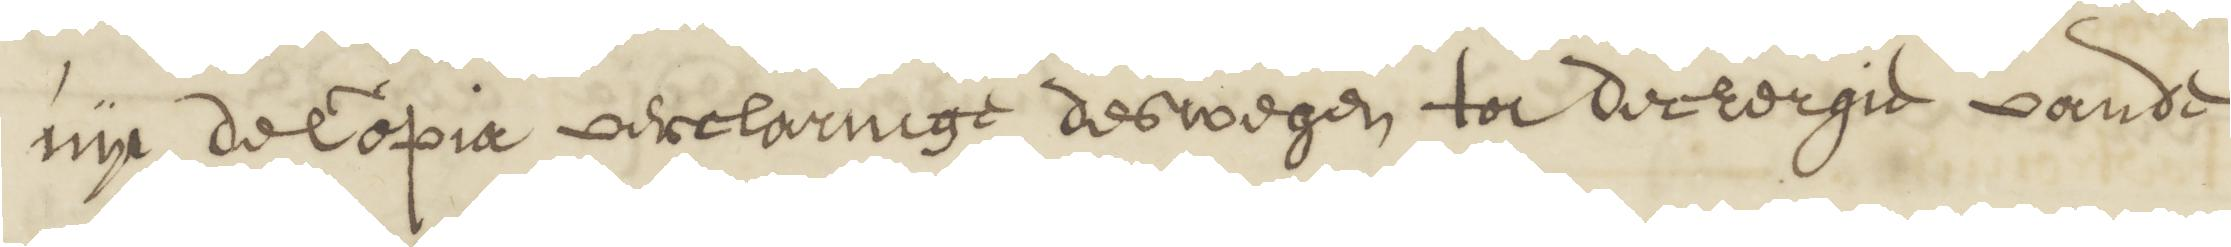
uijt de Copia verclaringe deswegen tot dechergie vande
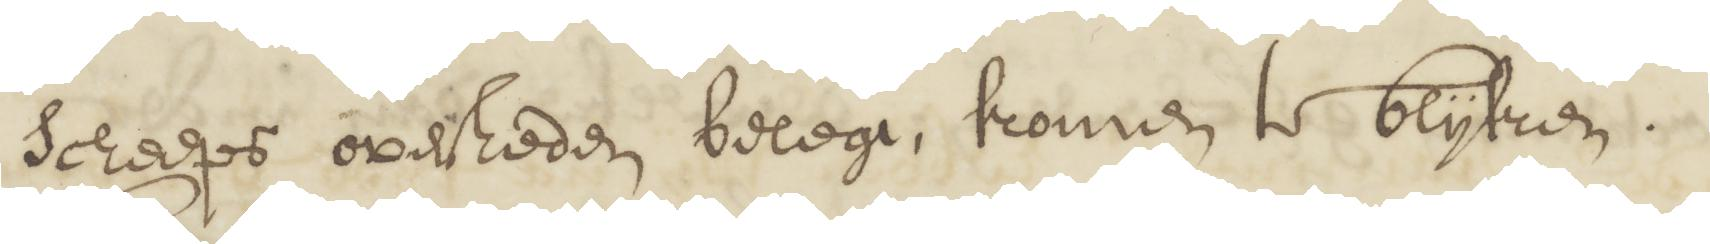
scheeps overheden belegt, komen te blijken.
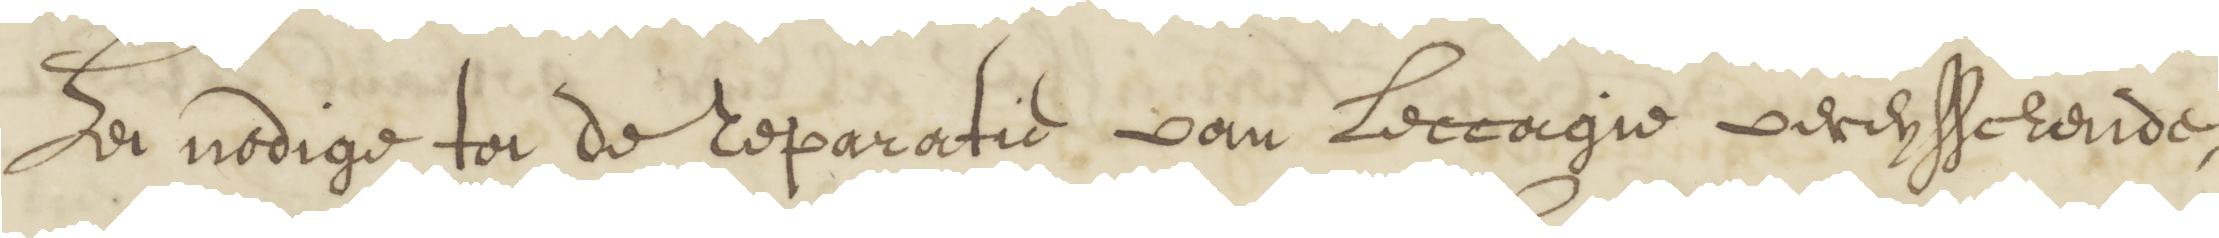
Het nodige tot de reparatie van leccagie vereysschende,
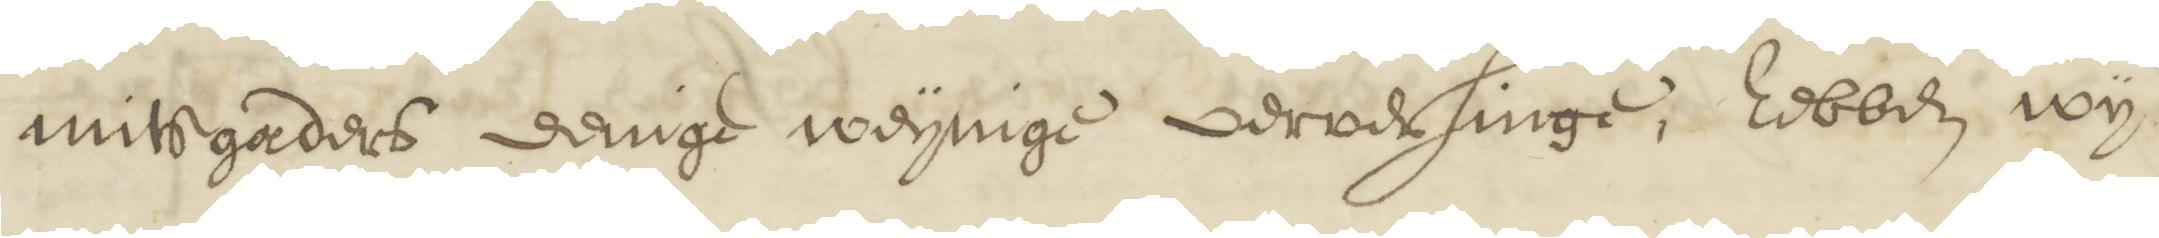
mitsgaders eenige weijnige verversinge, hebben wij
